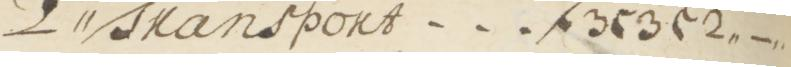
P„Transport - - - ƒ 35352 „–„
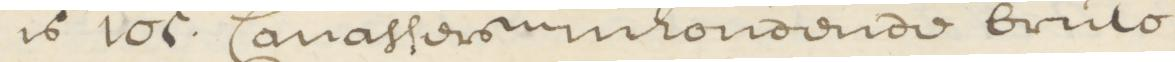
is 105. Canassers inhoudende bruto
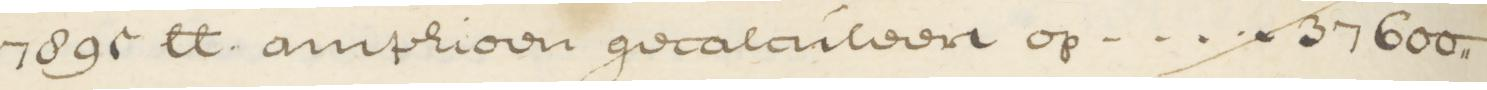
7895 lb. amphioen gecalculeert op - - - .ƒ 37600„
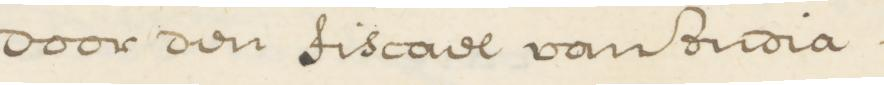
door den fiscael van India
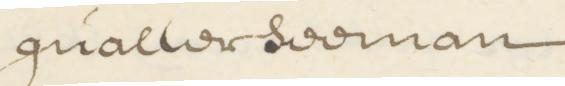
gualter seeman
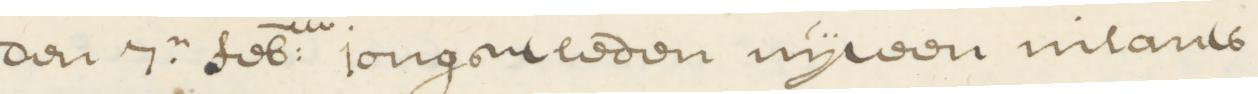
den 7.n feb: jongstleden uijt een inlants
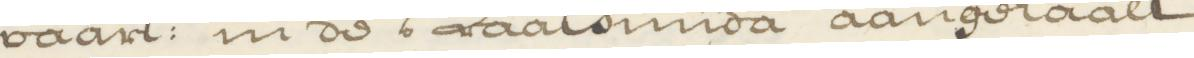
vaart: in de draalsunda aangehaalt
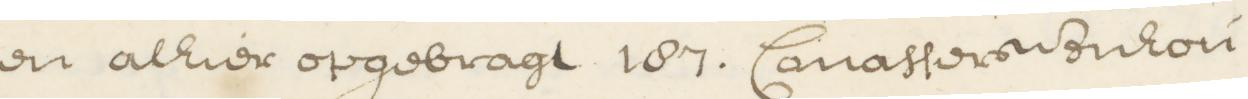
en alhier opgebragt 187. Canassers inhou
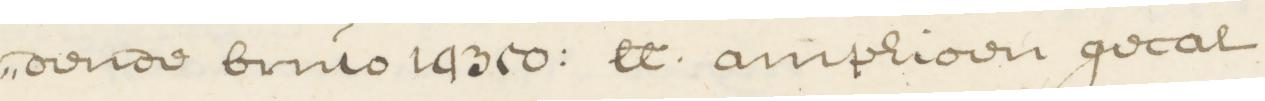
„dende bruto 14350: lb. amphioen gecal
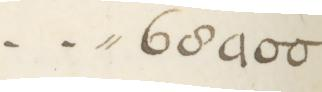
- - „ 68400
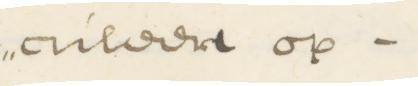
„culeert op - - - - - - - - - - - -
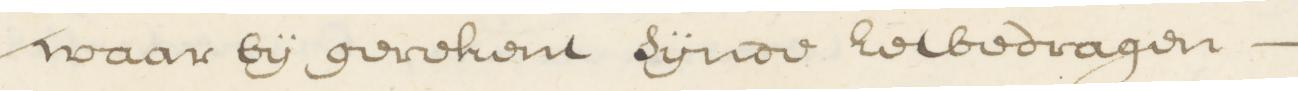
waar bij gerekent sijnde het bedragen —
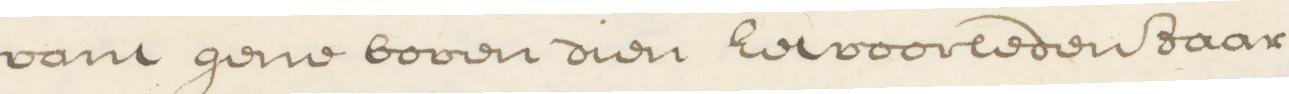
vant gene boven dien het voorleden daar
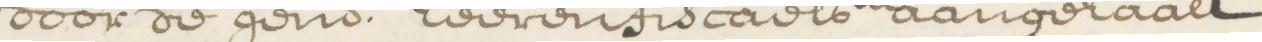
door de gend: heeren fiscaels aangehaalt
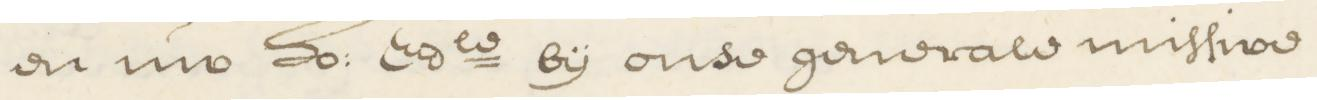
en uw Ho: Ed=le bij onse generale missive
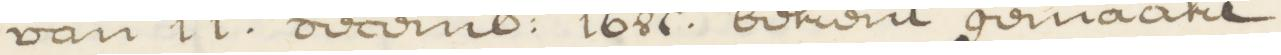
van 11.r decemb:r 1685. bekent gemaakt
